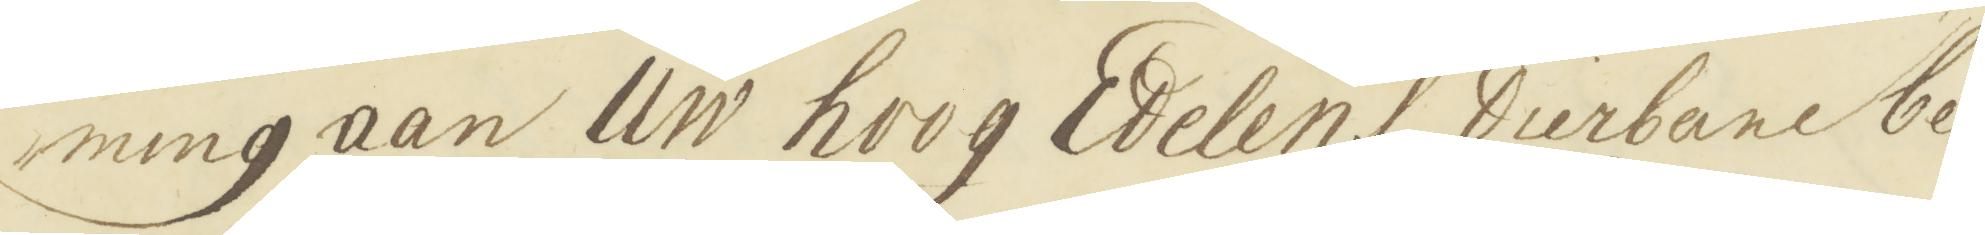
„ming aan Uw hoog Edelens dierbare be
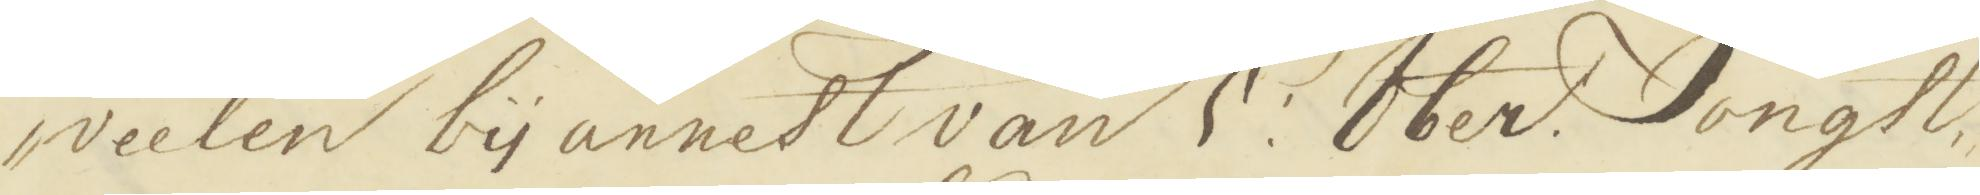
„veelen bij arrest van 5:' 8ber: Iongst„
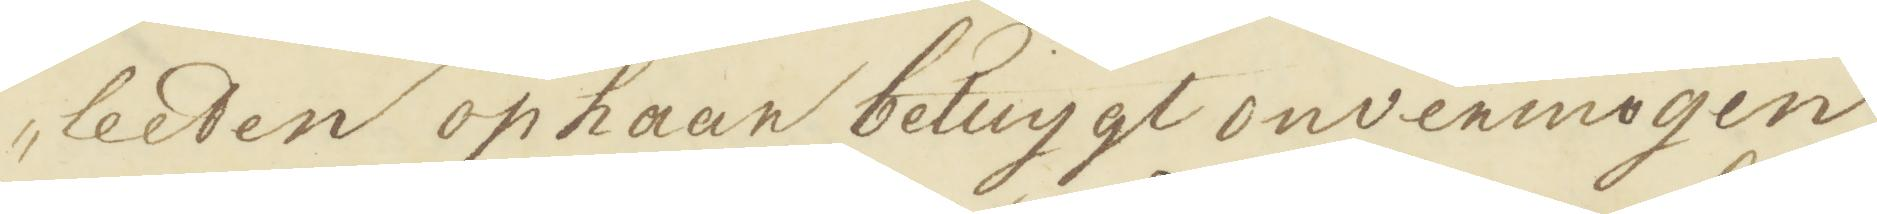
„leeden op haar betuijgt onvermogen
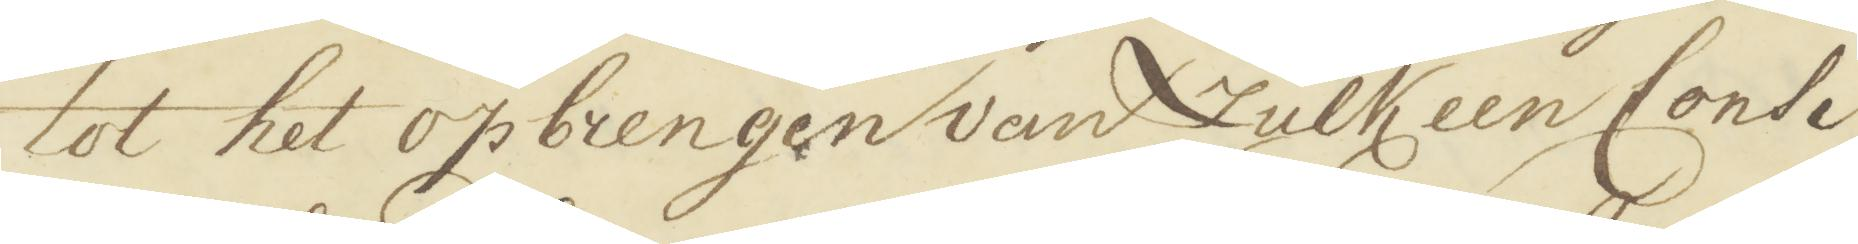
tot het opbrengen van zulk een Consi
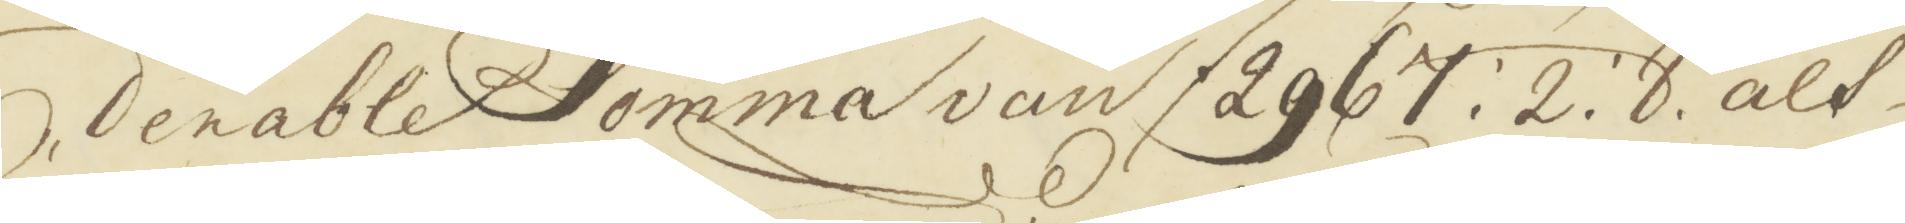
„derable Somma van ƒ2967: 2: 8. als
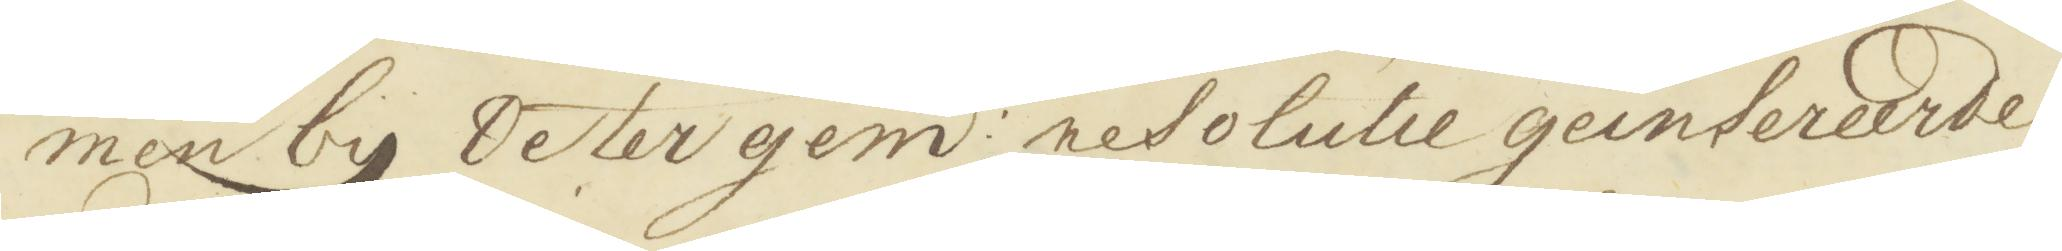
men bij de ter gem:e resolutie geinsereerde
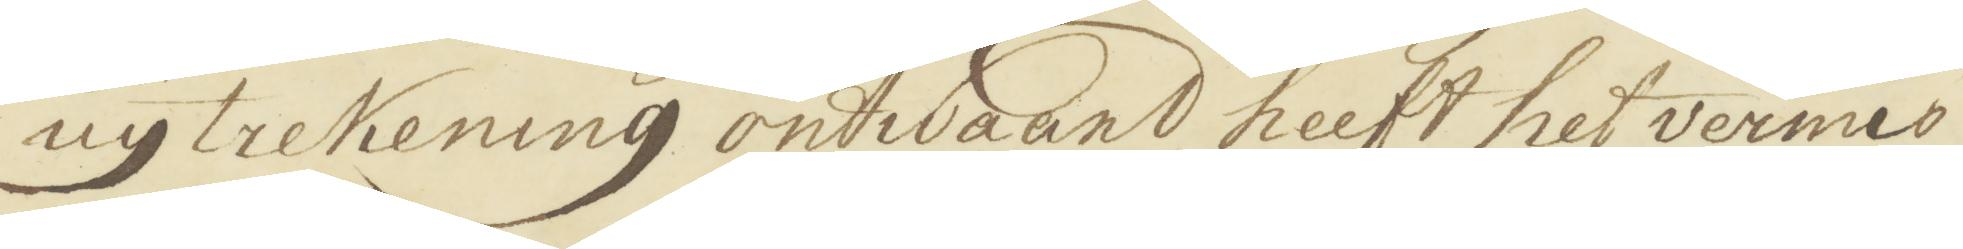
uijtrekening ontwaard heeft het vermis
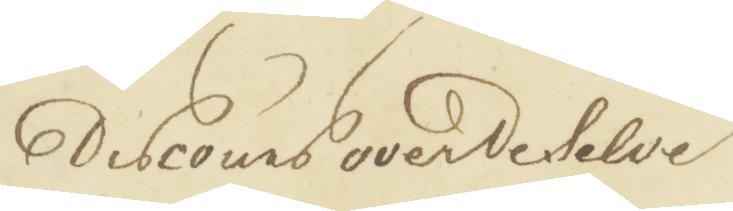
discours over deselve
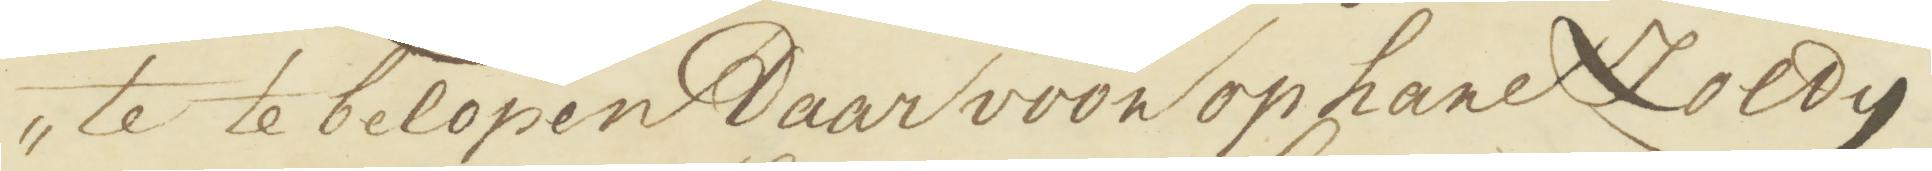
„te te belopen daar voor op hare zoldij
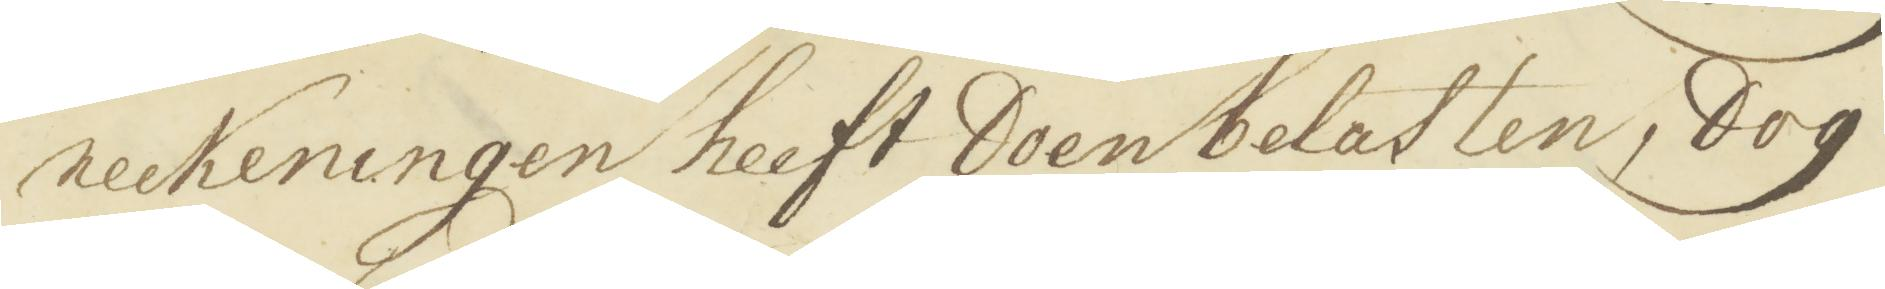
reekeningen heeft doen belasten, dog
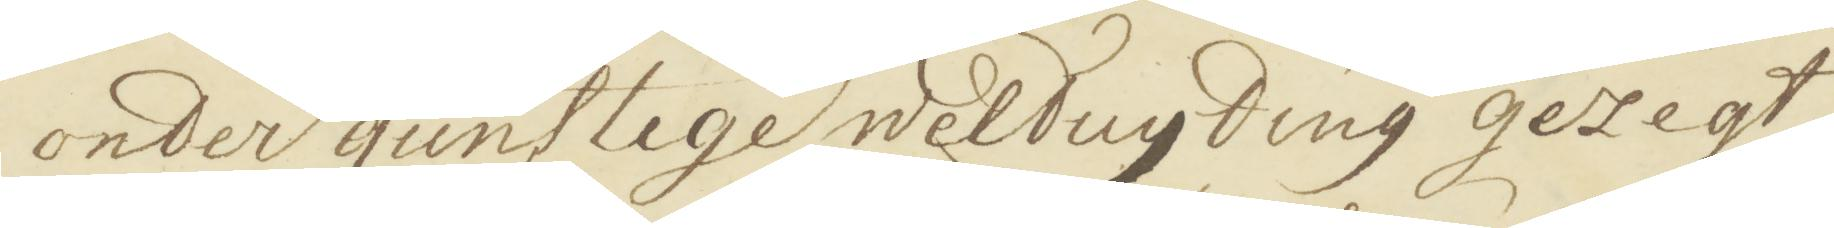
onder gunstige welduijding gezegt,
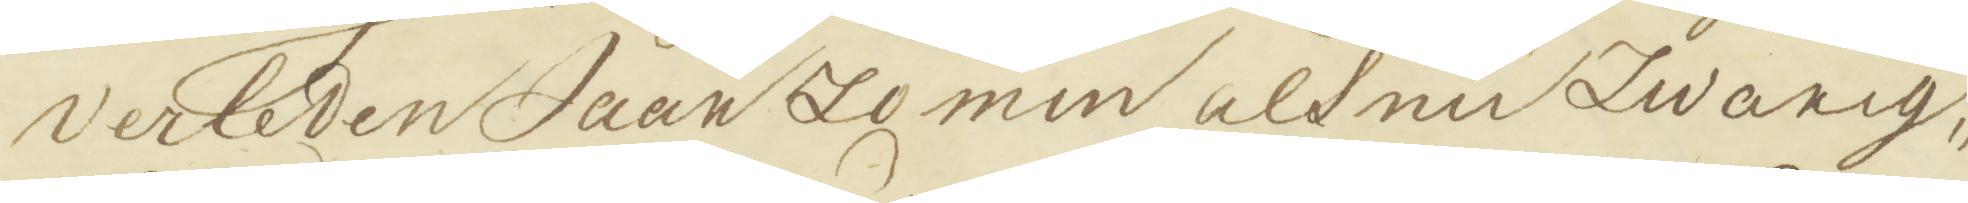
verleden Iaar zo min als nu zwarig„
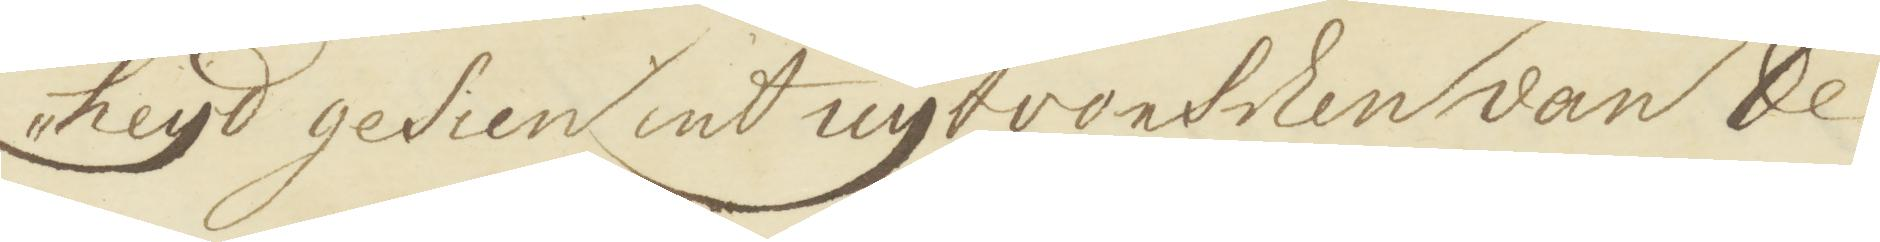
„heijd gesien in't uijtvorschen van de
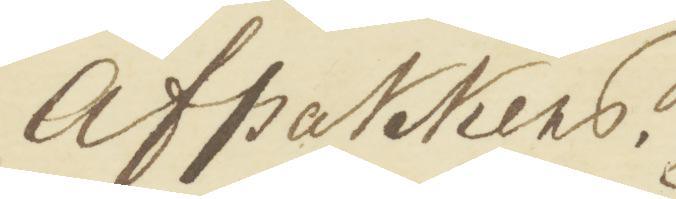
afpakkers,
